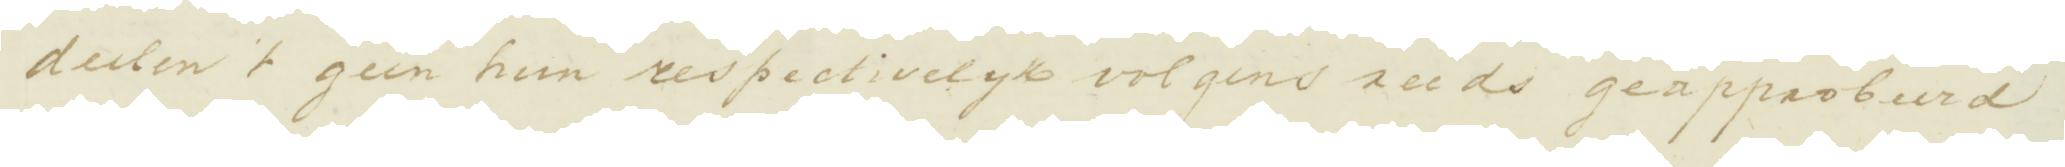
deelen ’t geen hun respectivelyk volgens reeds geapprobeerd
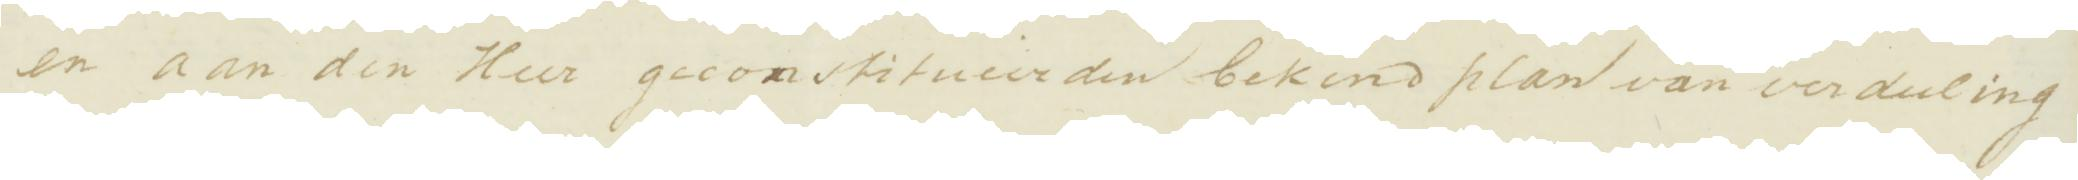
en aan den Heer geconstitueerden bekend plan van verdeeling
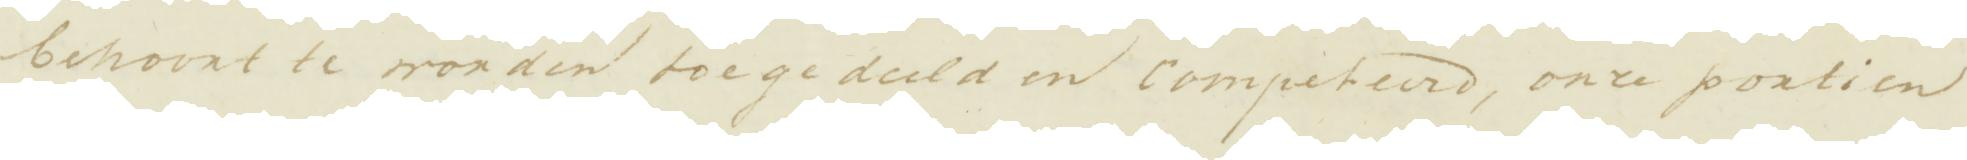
behoort te worden toegedeeld en competeerd, onze portien
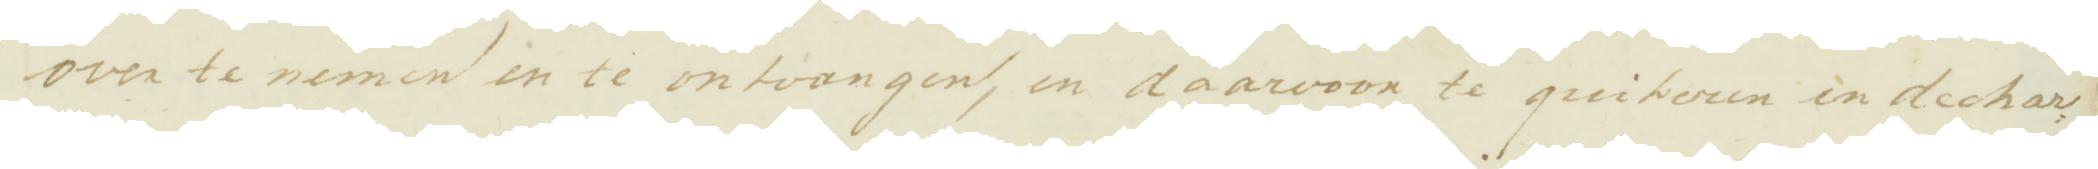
over te nemen en te ontvangen, en daarvoor te quiteren in dechar:
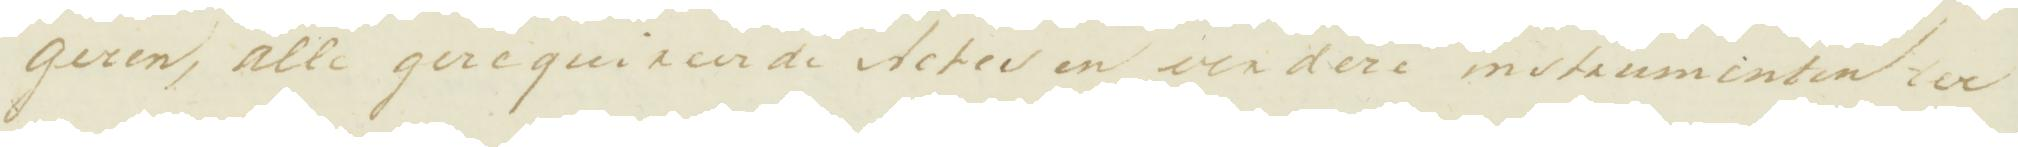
geren, alle gerequireerde Actes en verdere instrumenten ter
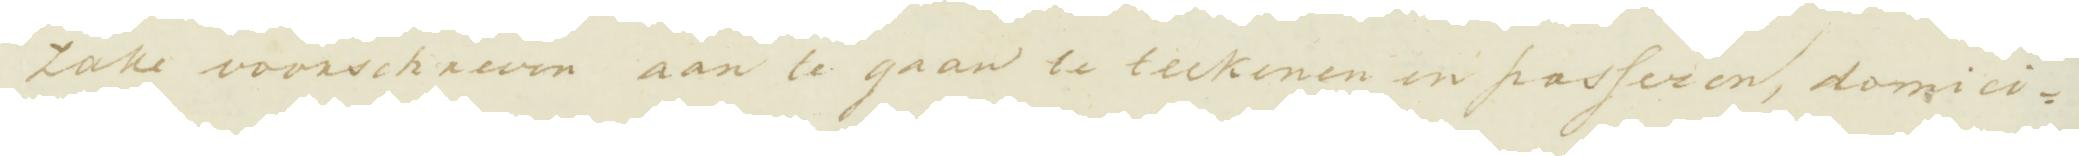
zake voorschreven aan te gaan te teekenen en passeren, domici=
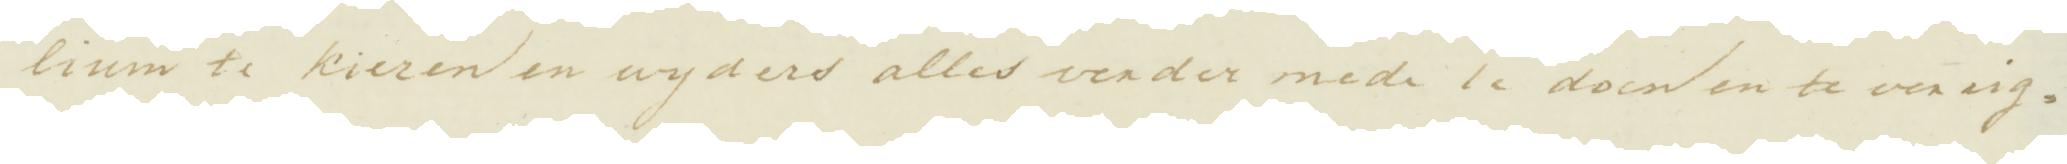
lium te kiezen en wyders alles verder mede te doen en te verrig=
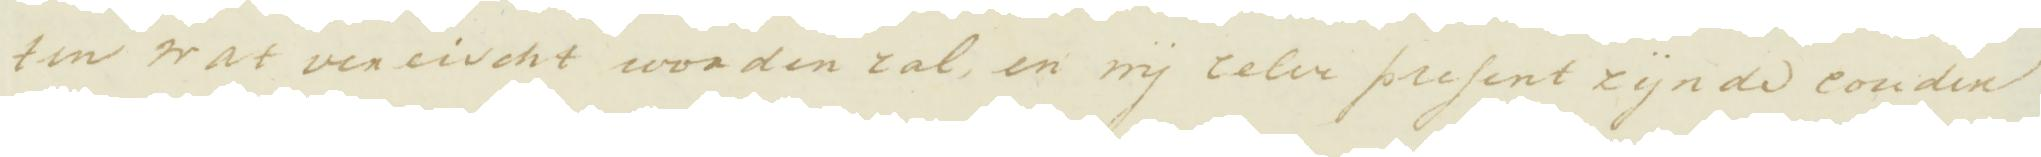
ten wat vereischt worden zal, en wij zelve present zijnde zouden
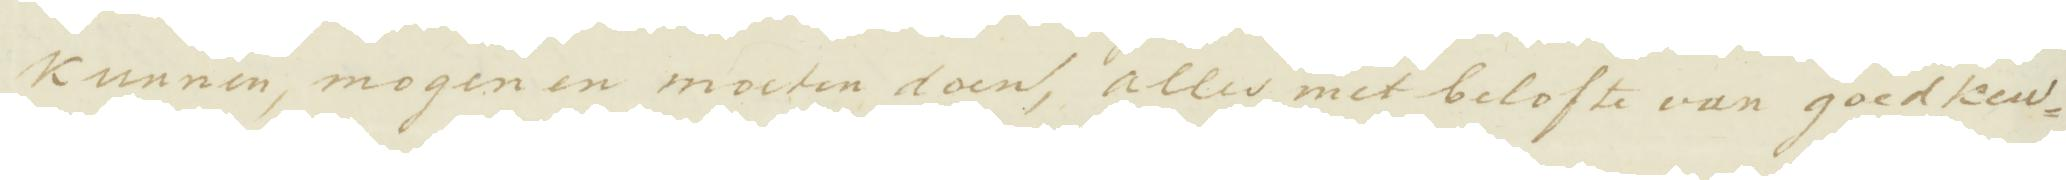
kunnen, mogen en moeten doen, alles met belofte van goedkeu=
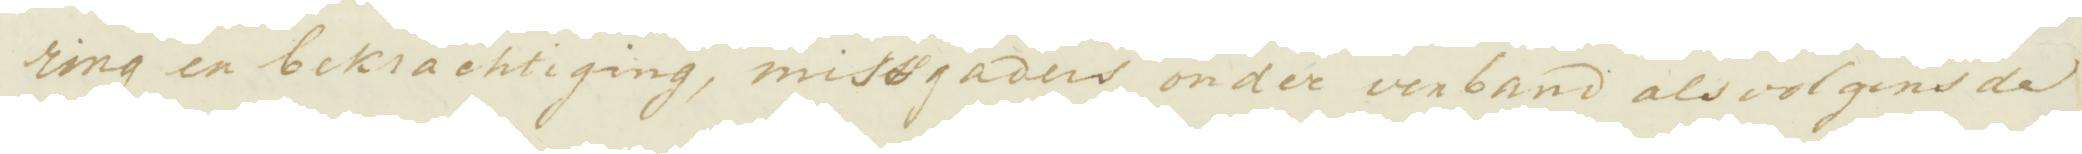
ring en bekrachtiging, mitsgaders onder verband als volgens de
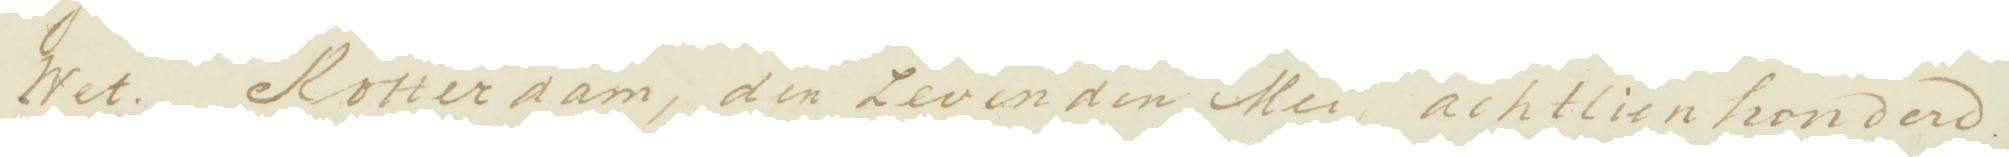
Wet. Rotterdam, den zevenden Mei, achttien honderd.
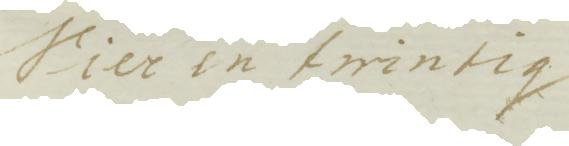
Vier en twintig
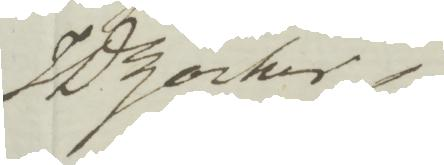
JDJonker
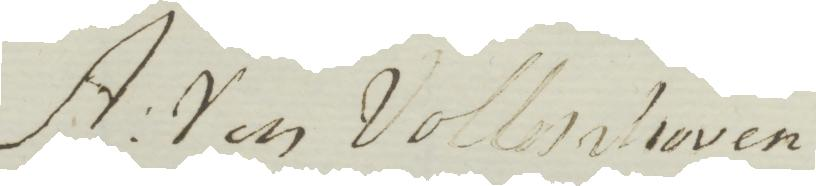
A: Van Vollenhoven
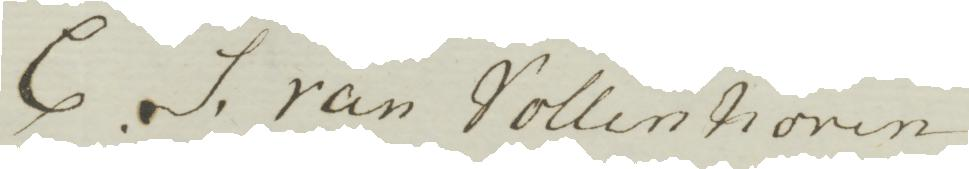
C. I. van Vollenhoven
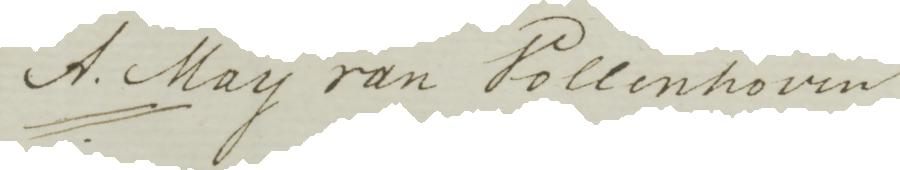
A. Maij van Vollenhoven
